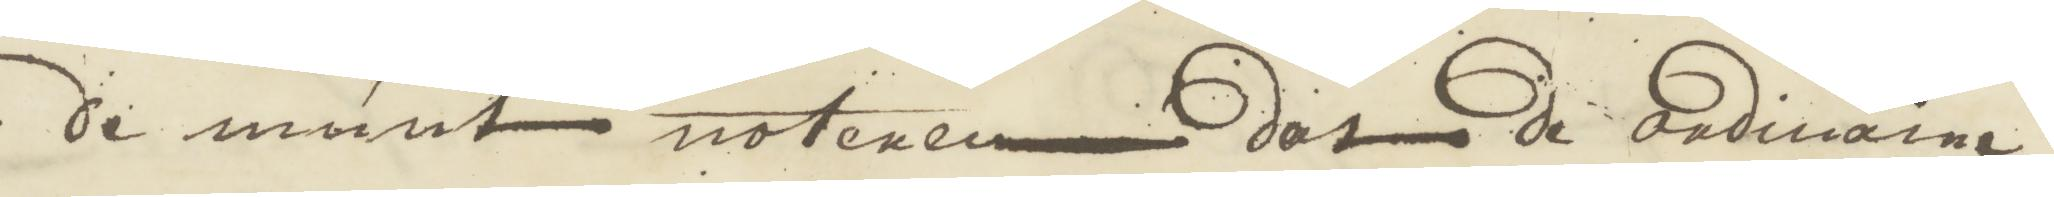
de munt noteren dat de ordinaire
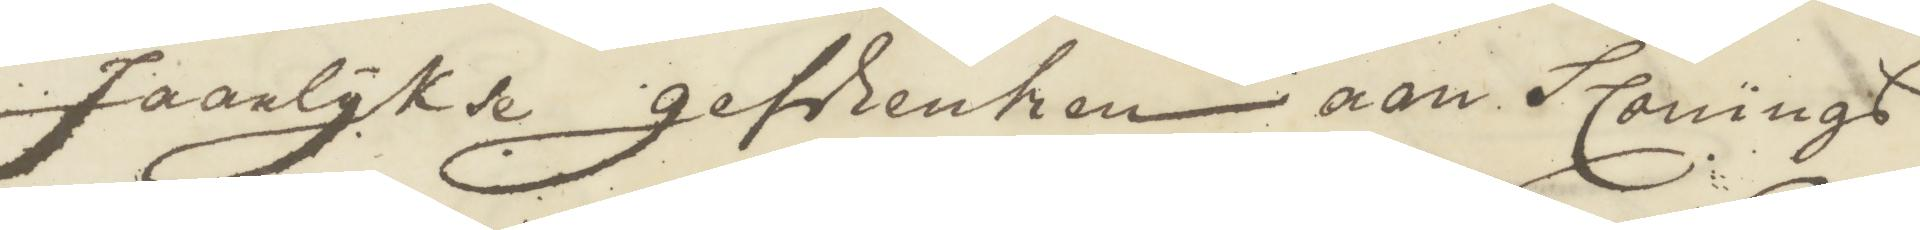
Jaarlijkse geschenken aan s Conings
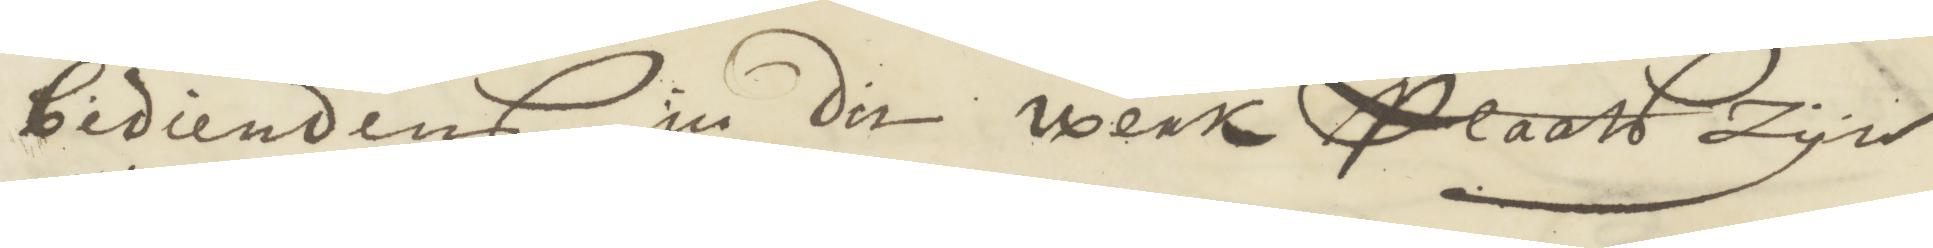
bediendens in dit werk plaats zijn
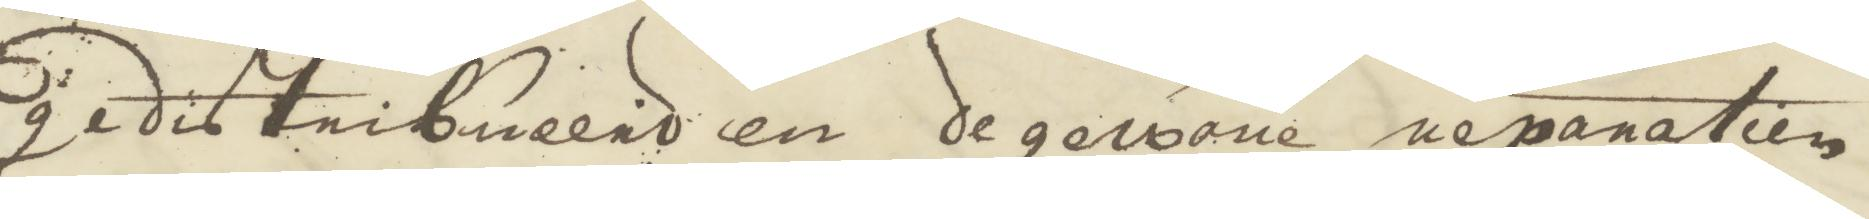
gedistribueerd en de gewone reparatien
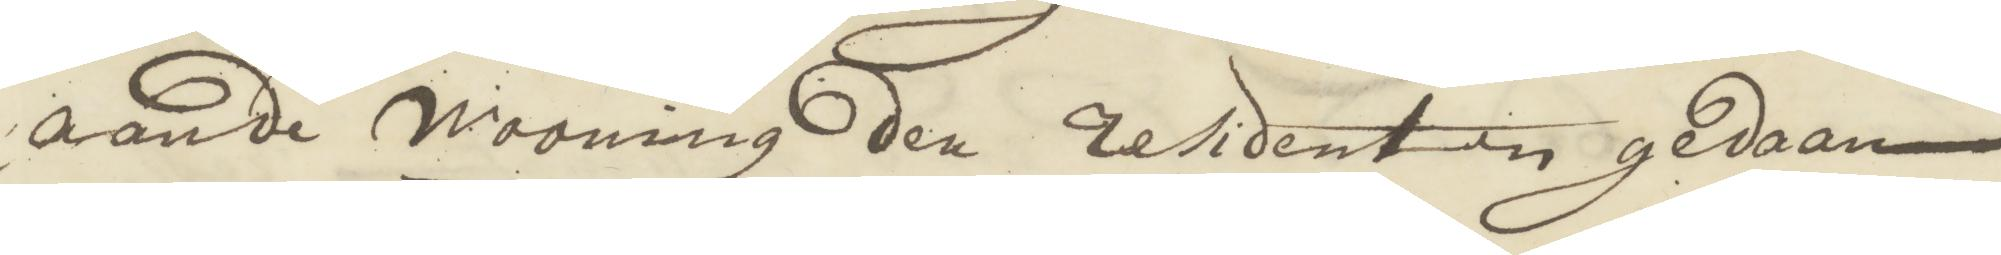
aan de wooning der residenten gedaan
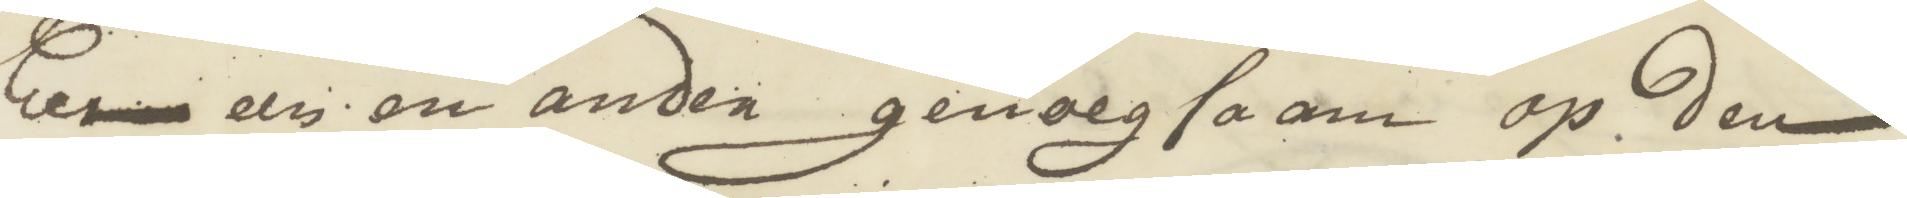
het een en ander genoegsaam op den
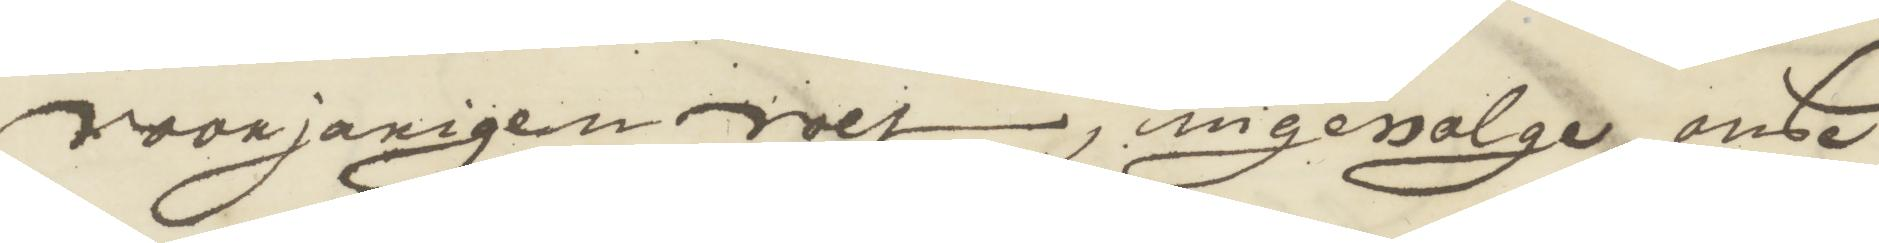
voorjarigen voet, ingevolge onse
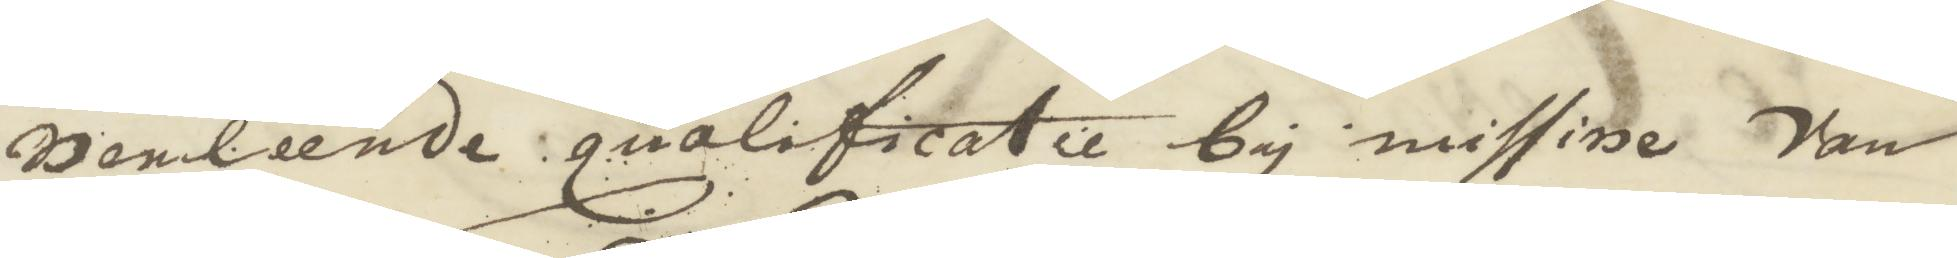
verleende qualificatie bij missive van
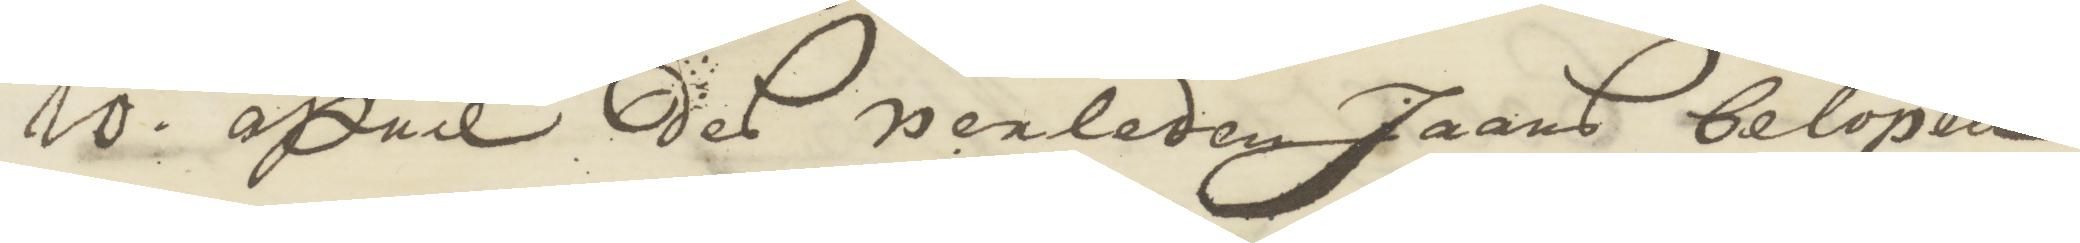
10. april des verleden Jaars belopen
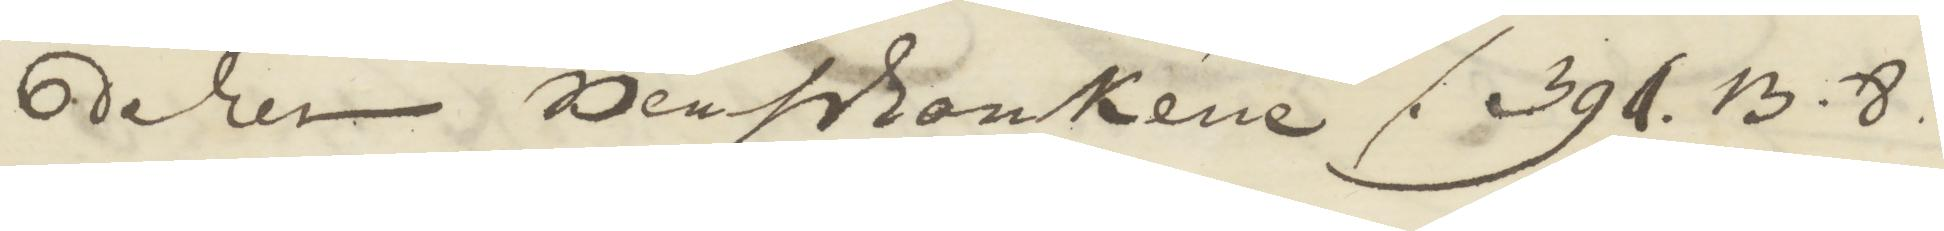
de het verschonkene ƒ 394.13. 8.
